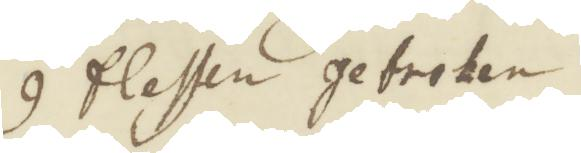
9 flessen gebroken
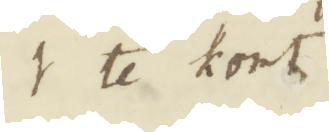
1 te kort
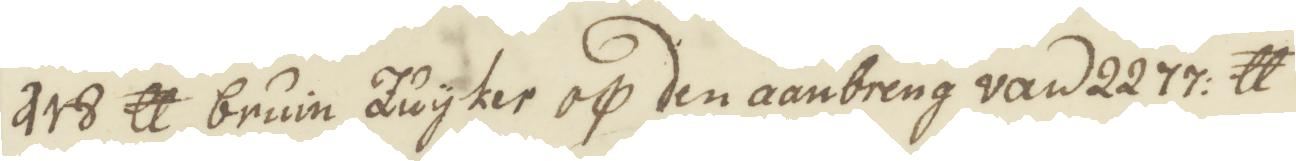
418 lb bruin zuijker op den aanbreng van 2277: lb
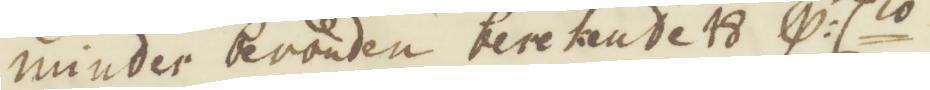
minder bevonden berekende 18 p:rC=to
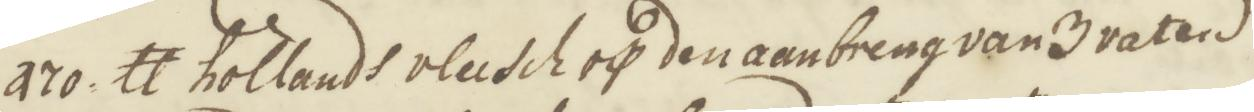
470. lb hollands vleesch op den aanbreng van 3 vaten
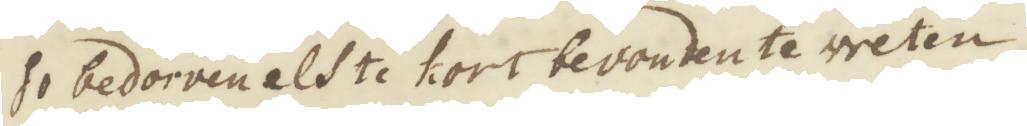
so bedorven als te kort bevonden te weten
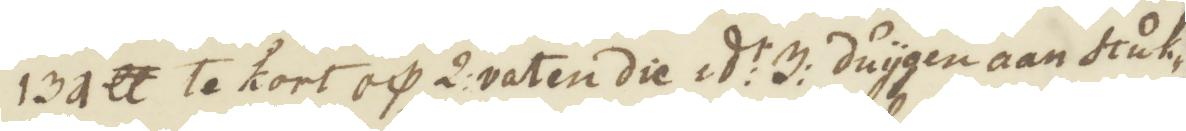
134 lb te kort op 2: vaten die id:r 3: duijgen aan stuk„
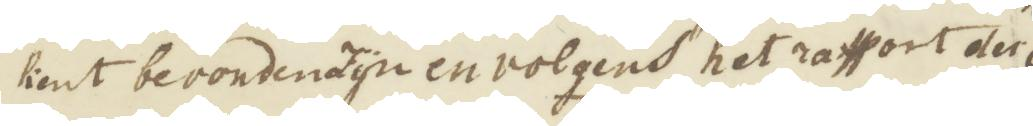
kent bevonden zijn en volgens het rapport der
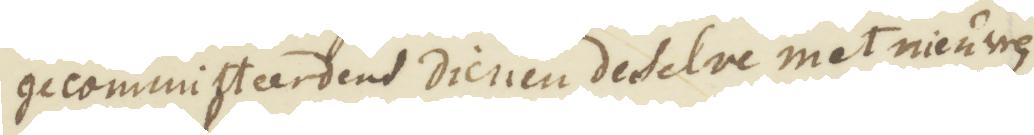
gecommitteerdens dienen deselve met nieuwe
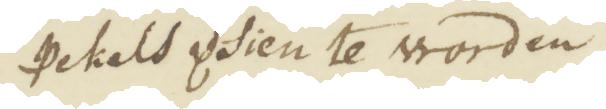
pekels versien te worden
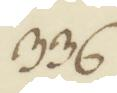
336
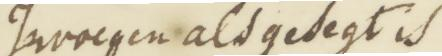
Jnvoegen als gesegt is
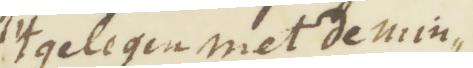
’t gelegen met de min„
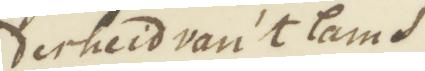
derheid van ’t lams
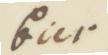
bier
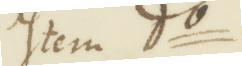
Jtem d=o
